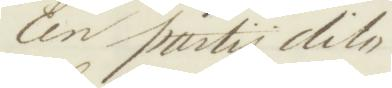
Een partij dito
